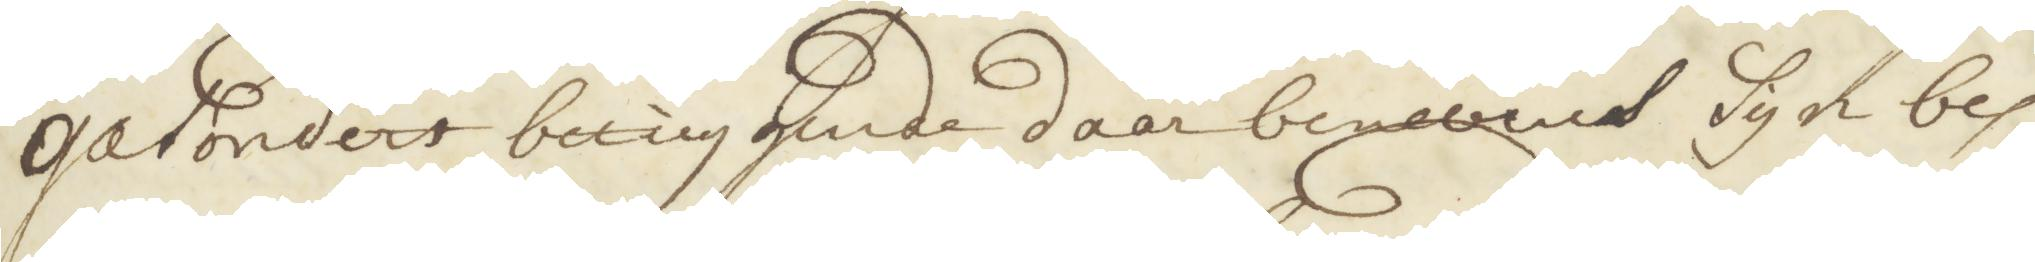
gesondert betuygende daar benevens sijn be
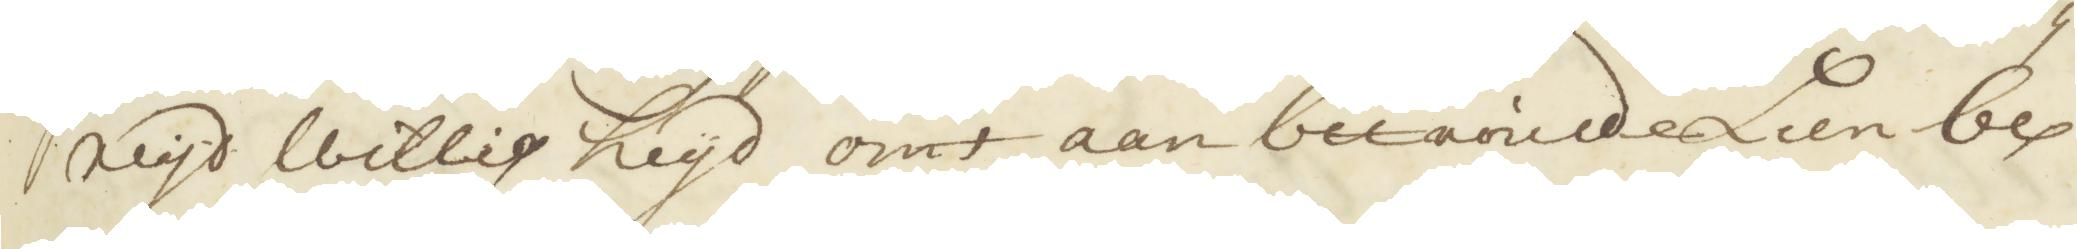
„reijd willig heijd omt aan betroude Leen be
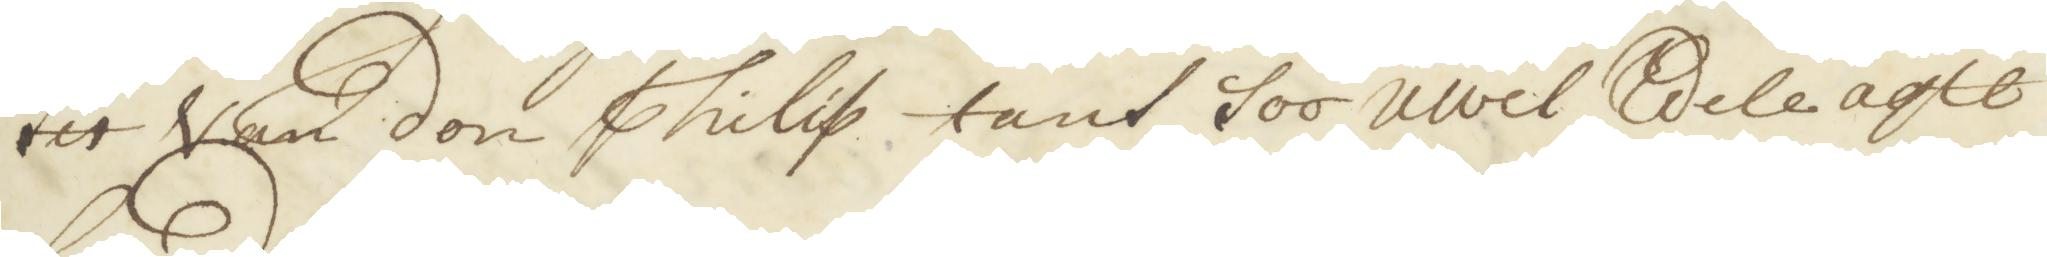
sit Van don Philip tans soo uwel Edele agtb
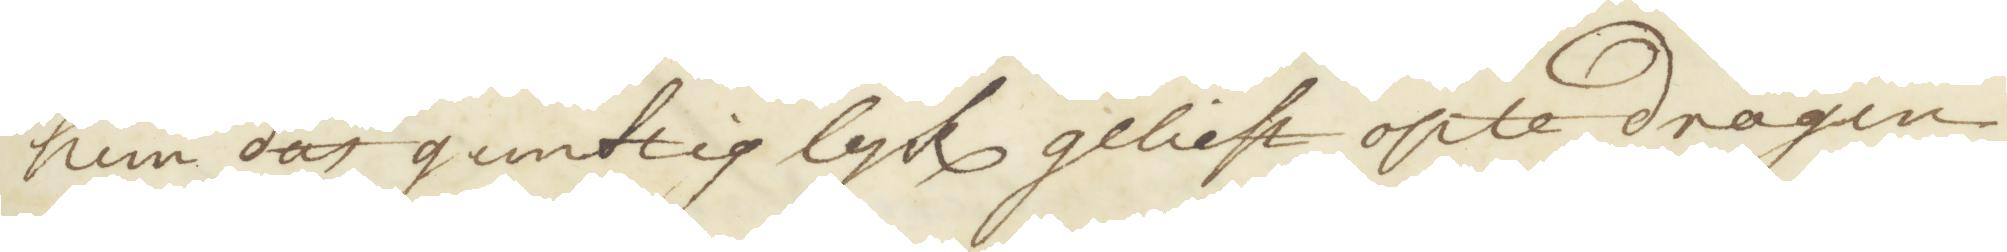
hem dat gunstig lyk gelieft opte dragen
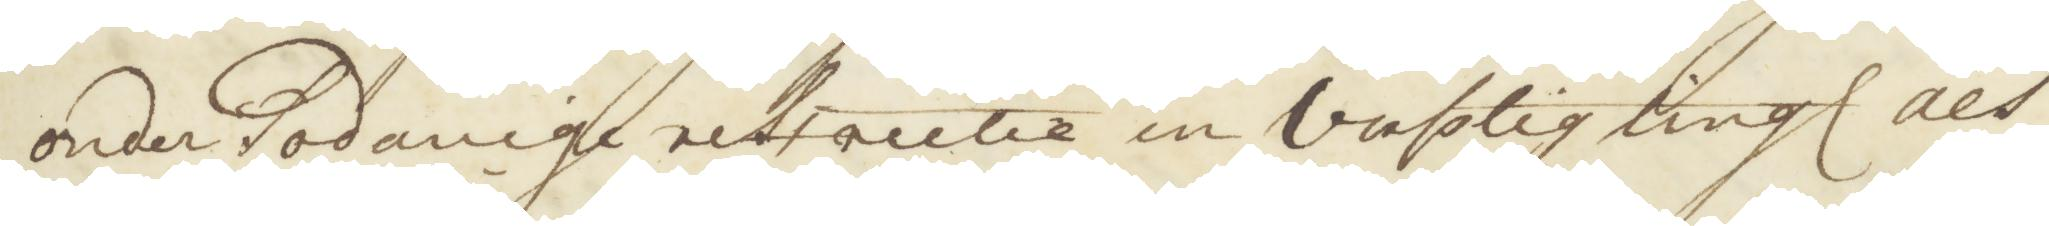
onder sodanige restrictie in Verpligtingh als
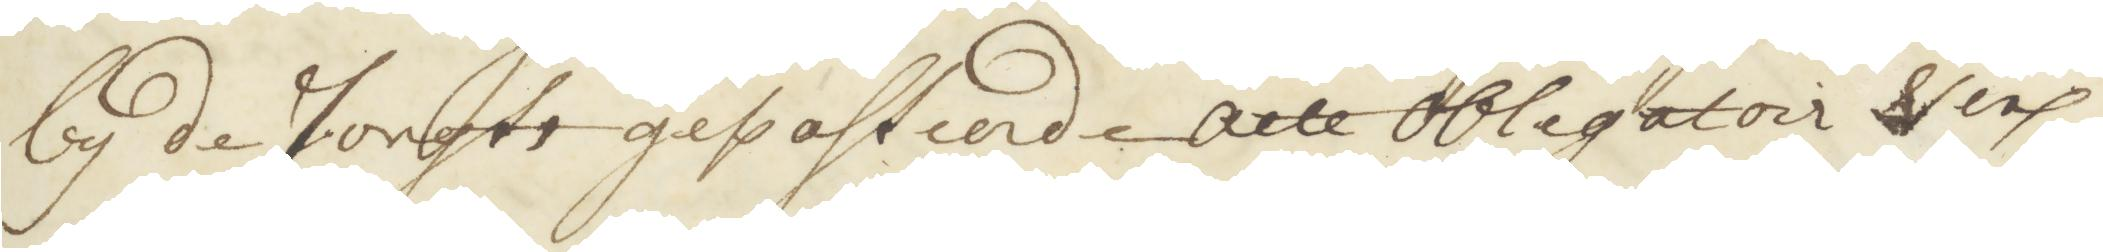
by de Jongst gepasseerde acte Obligatoir Ver
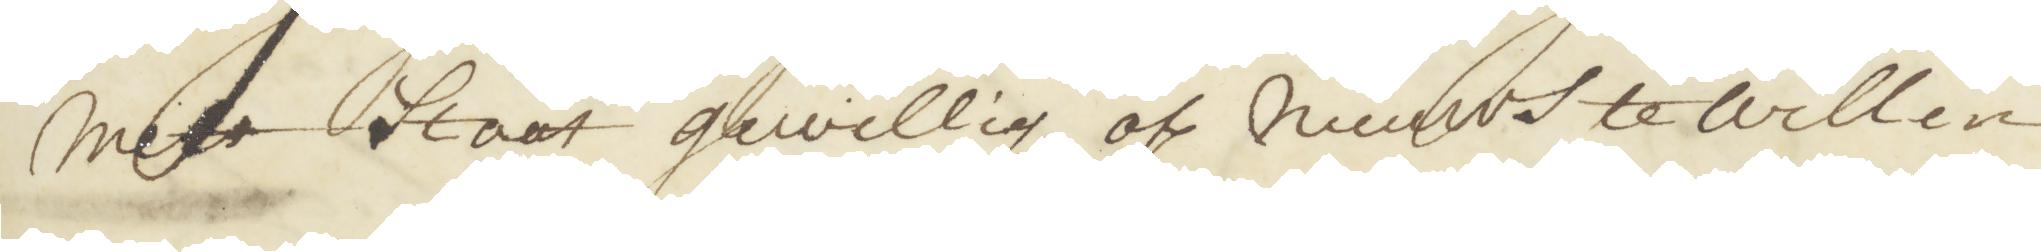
melt staat gewillig of nieuws te willen
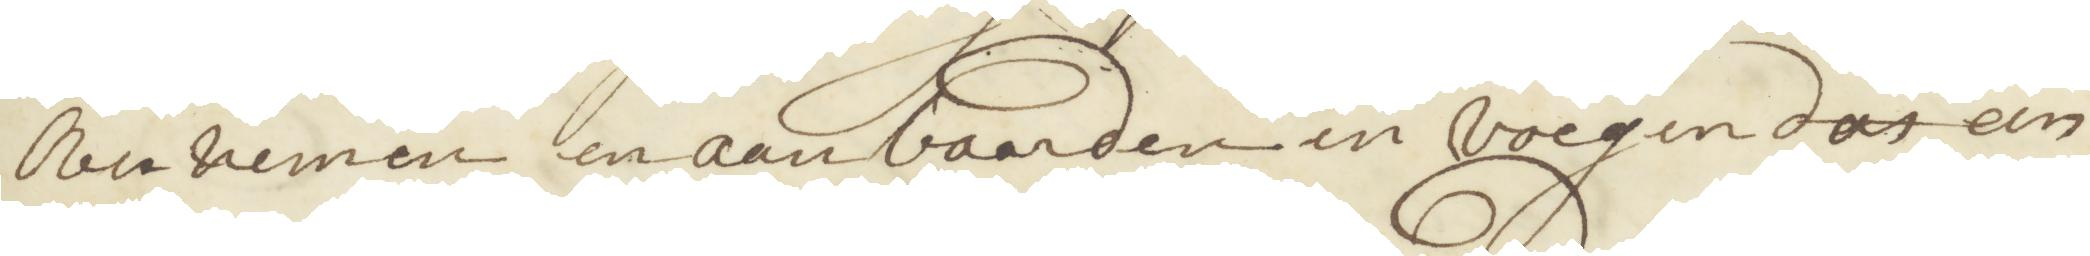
Ver nemen en aan banden in voegen dat een
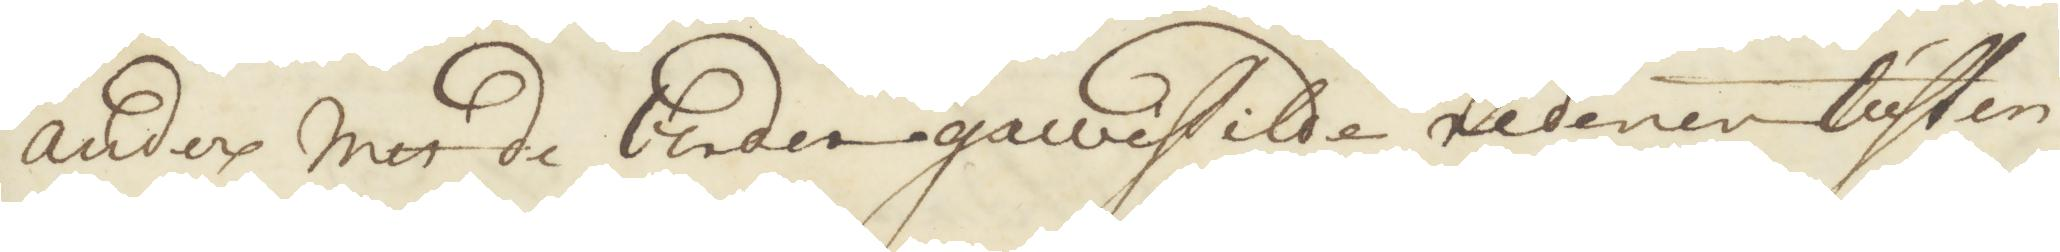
ander met de Verder gawisselde redenen tussen
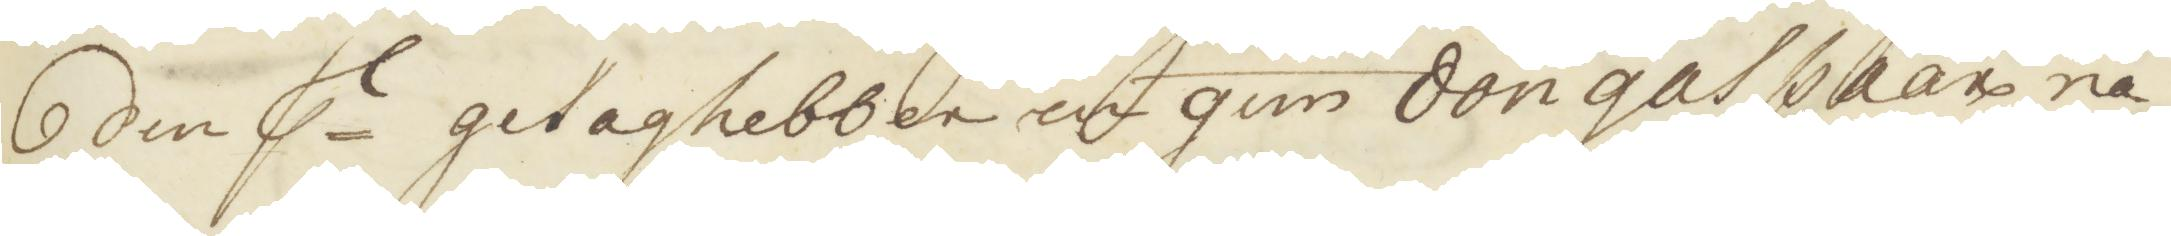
den p=l gesaghebber en gun don gaspaar na
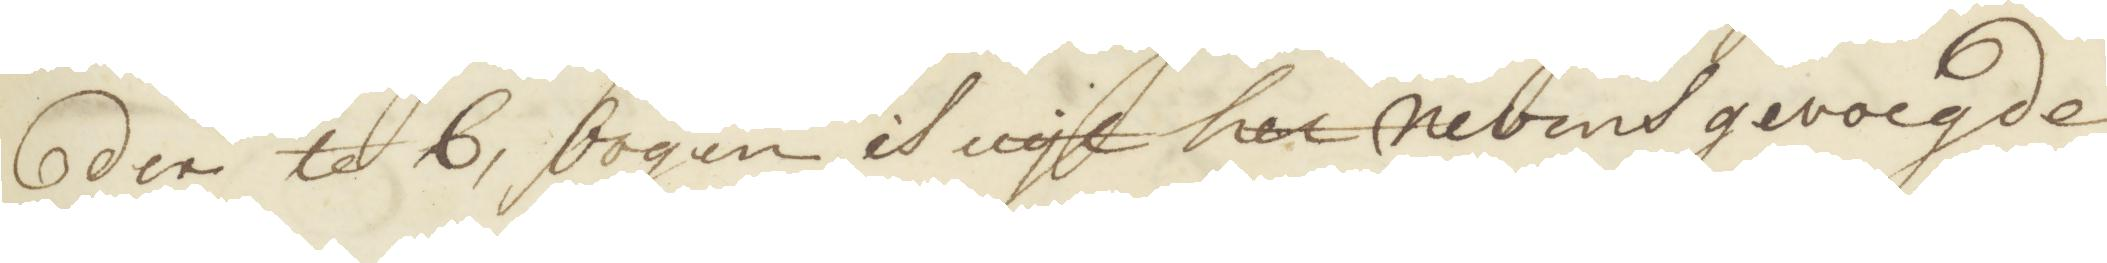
der te 6, bogen is uijt het nevens gevoegde
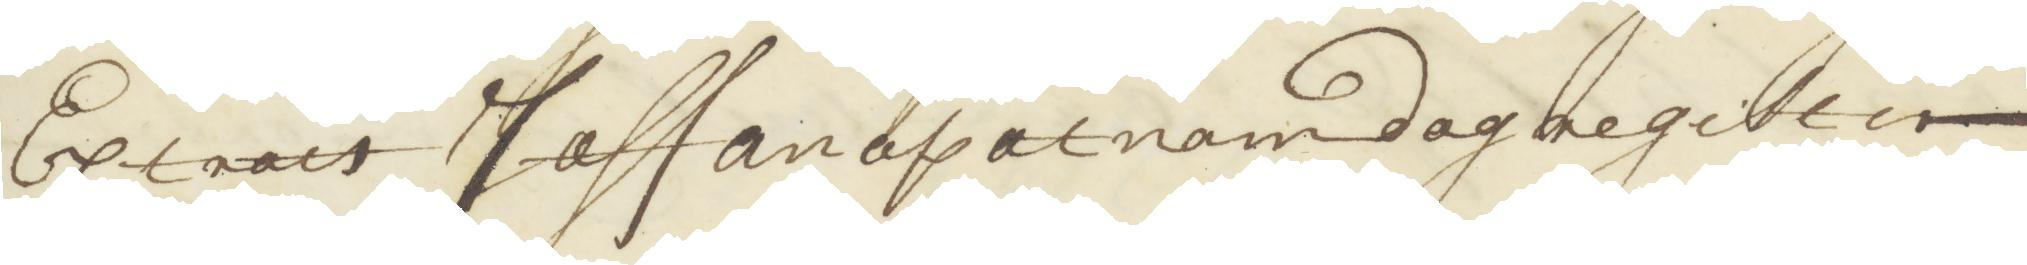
Extract Jaffanapatnamdag register
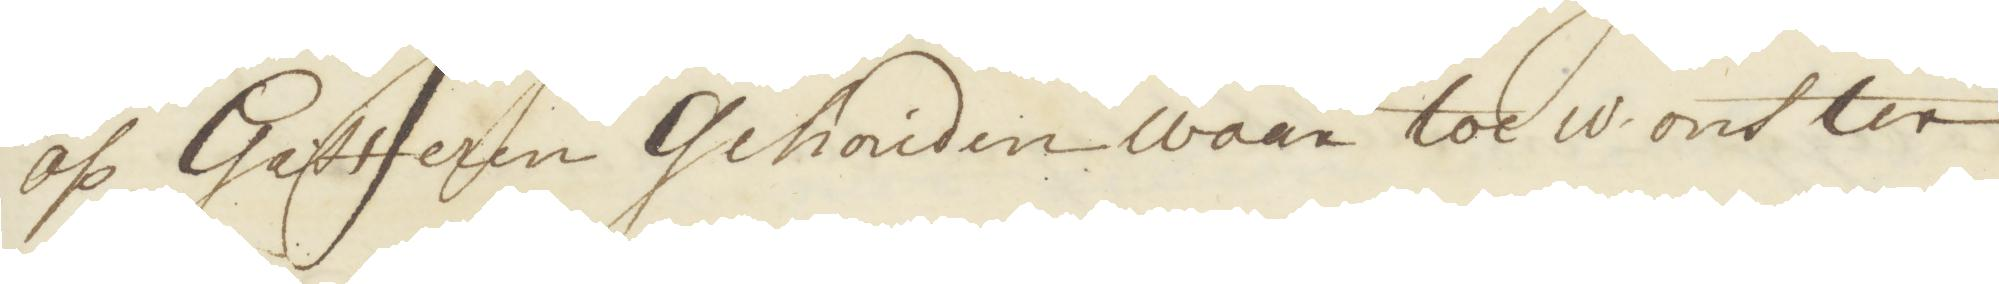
op Gisteren Gehouden waar toe u ons ter
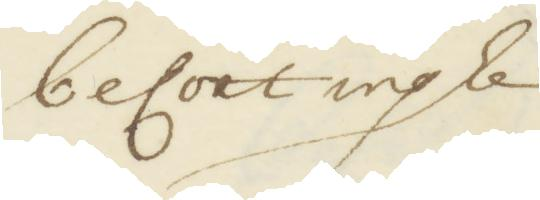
becortinghe
